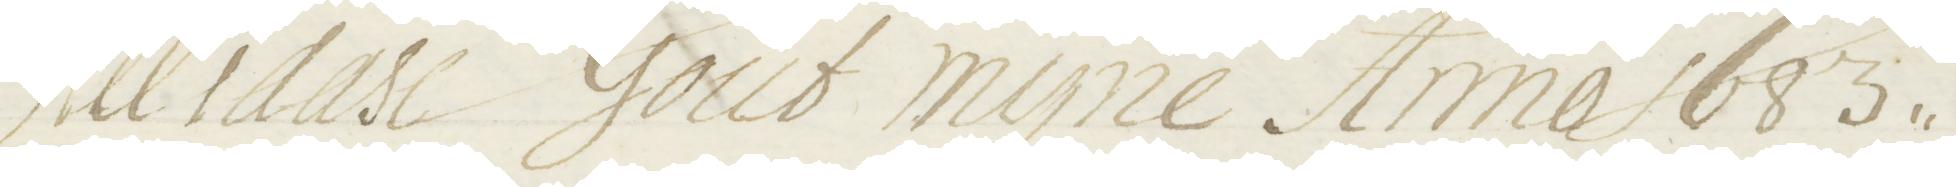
Sillidase Gout mijne Anno 1683
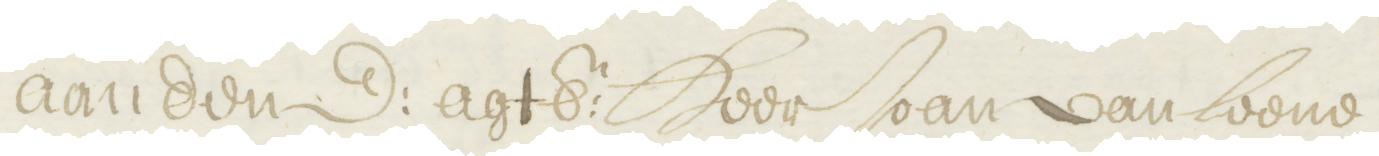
aan den E: agtb: Heer Joan van leene
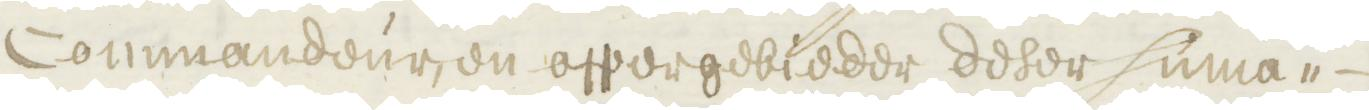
Commandeur, en oppergebieder deser Suma„
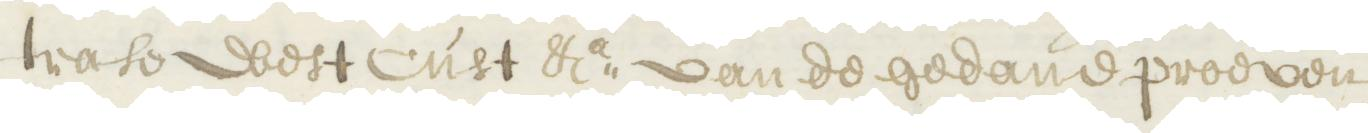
trase west cust &„a van de gedane proeven
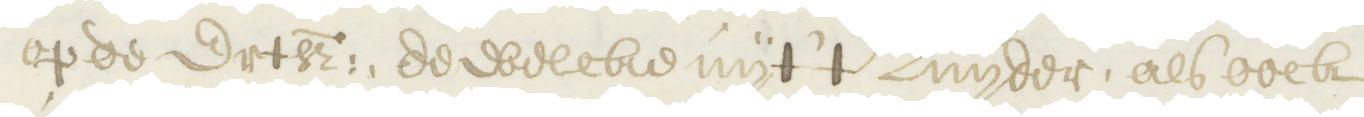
op de Ertsz: de welcke uijt ’t Zuijder, als oock
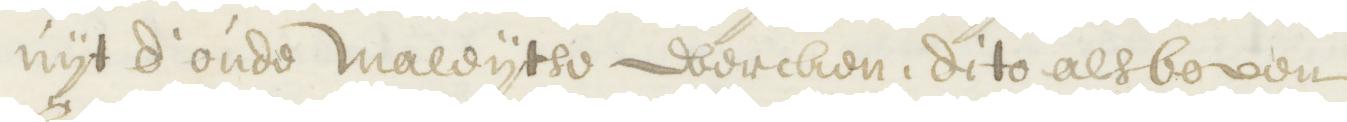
uijt d’oude maleijtse wercken, dito als boven
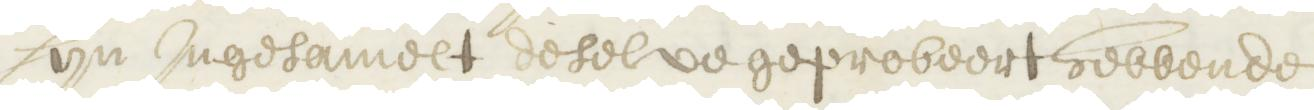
Sijn Jngesamelt deselve geprobeert hebbende
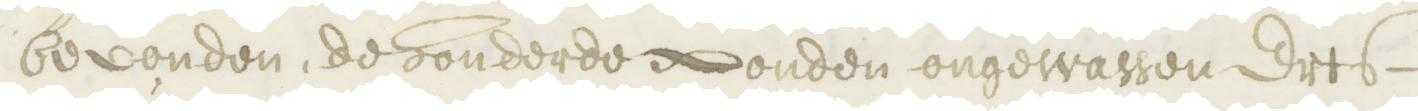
bevonden, de honderde ponden ongewassen Erts
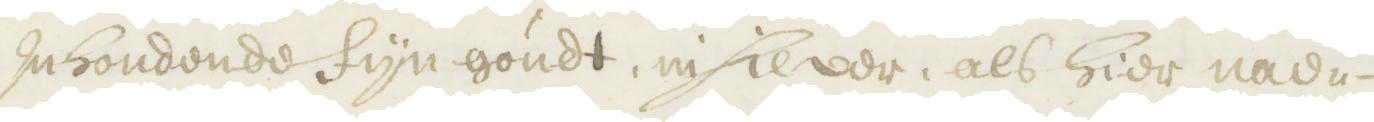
Jnhoudende fijn goudt, in Silver, als hier naer
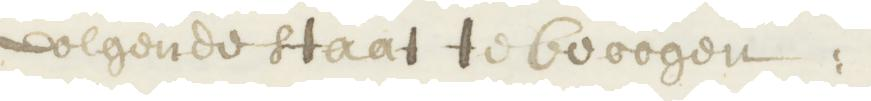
volgende staat te beoogen:
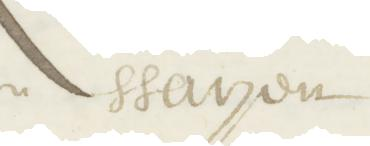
Assijen
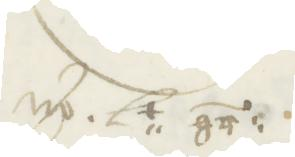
no. l:t : gr:
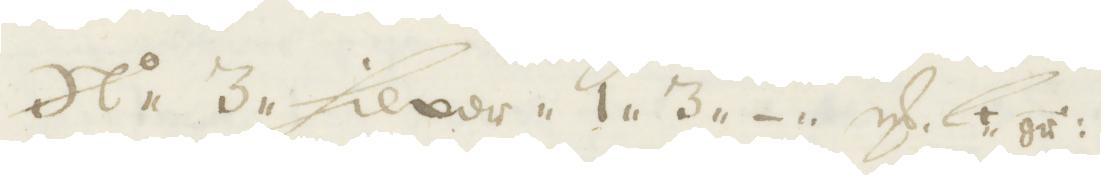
N„o 3„ silver „ 1 „ 3„ - „ no. l:t gr;t :
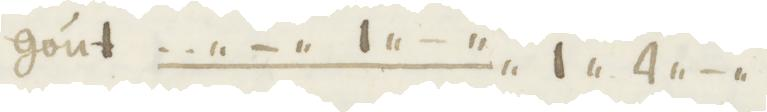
gout ..„ - „ 1„-„ „ 1„ 4„ - „
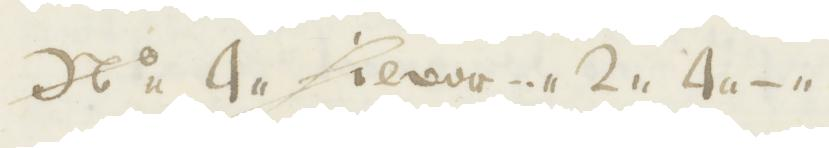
N„o 4 „ silver ..„ 2„ 4„ - „
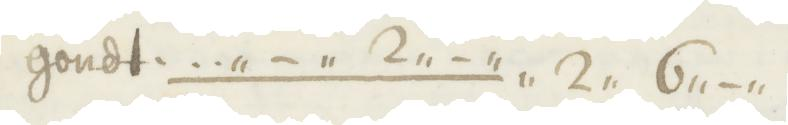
goudt. . .„ - „ 2„ - „ „ 2„ 6„ –„
